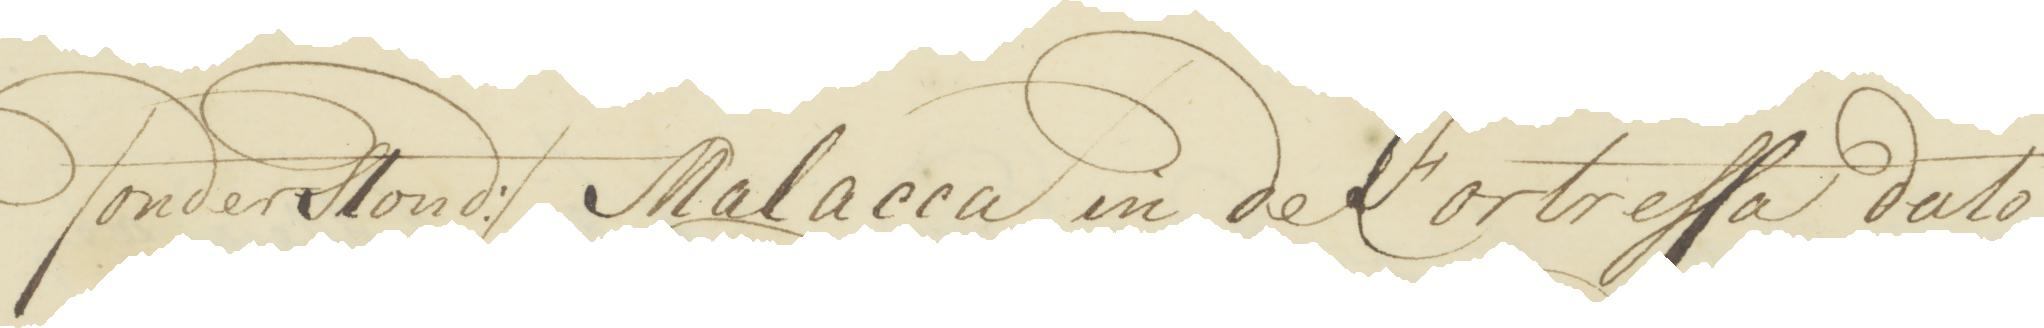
/onderstond:/ Malacca in de Fortressa dato
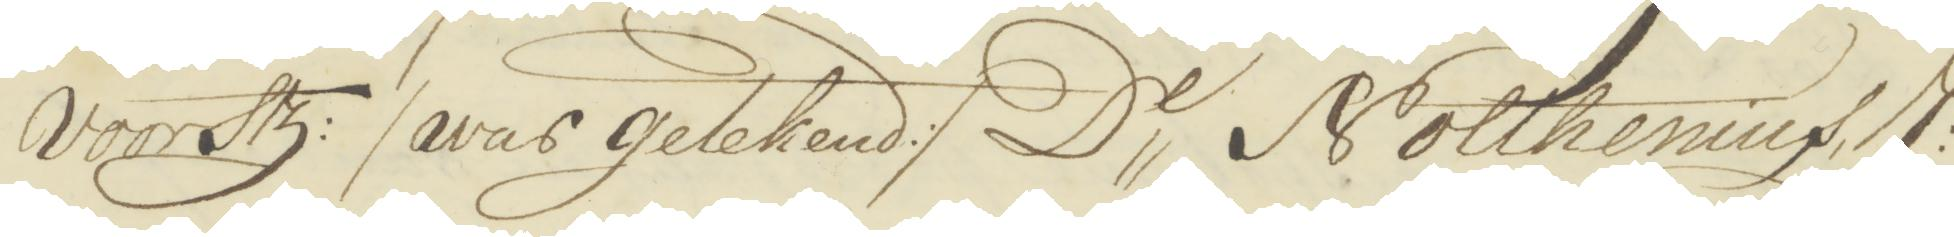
voorsz: /was getekend:/ D„l Nolthenius J:
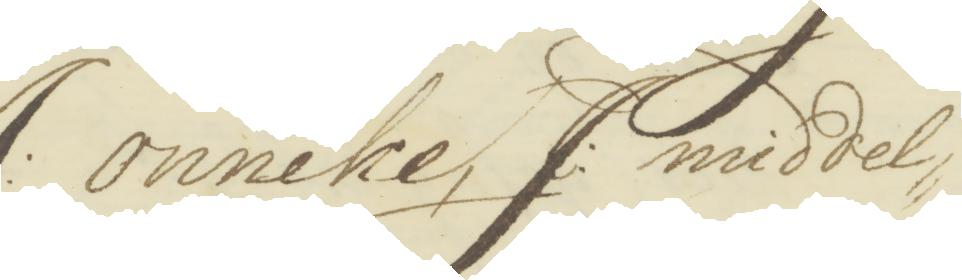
. . . J: onneke, J: middel„
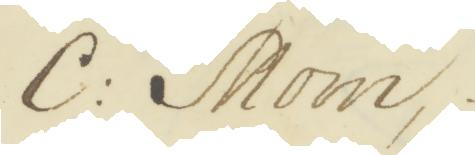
C: Mom,
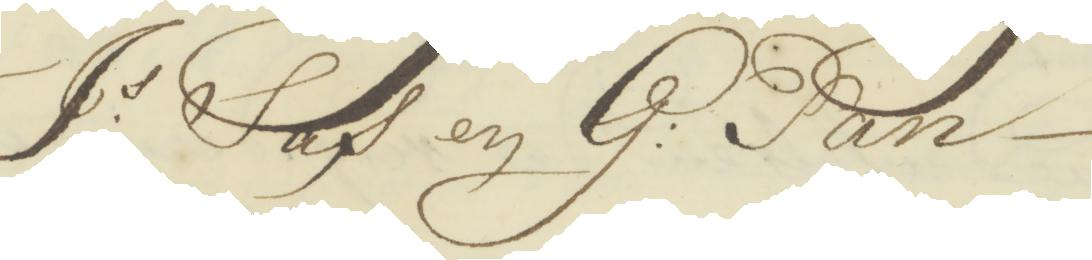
J:s Sas en G: Pan
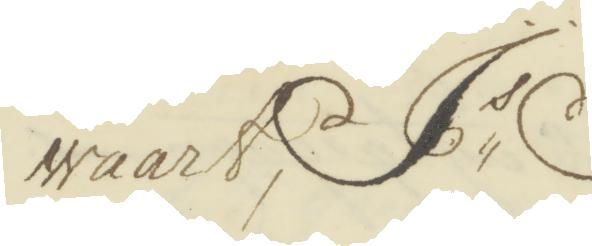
waart J„s
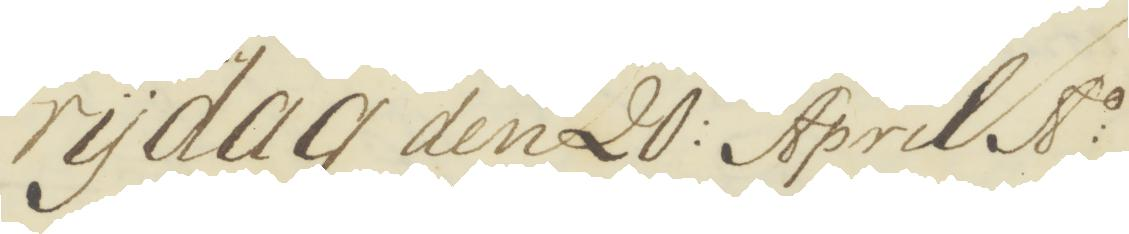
Vrijdag den 20:' April A:o
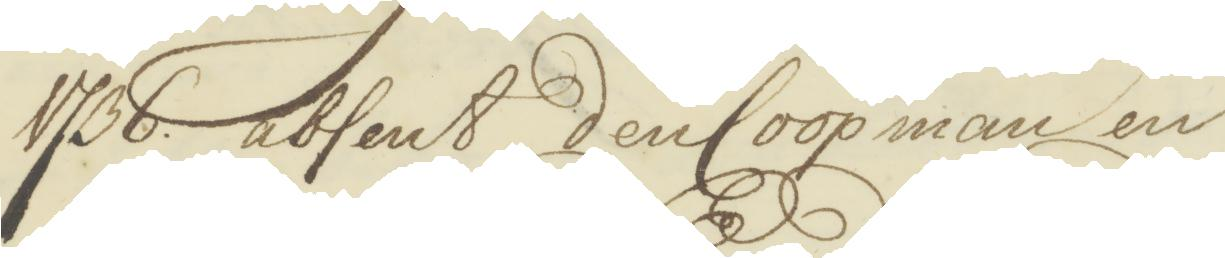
1736. absent den Coopman en
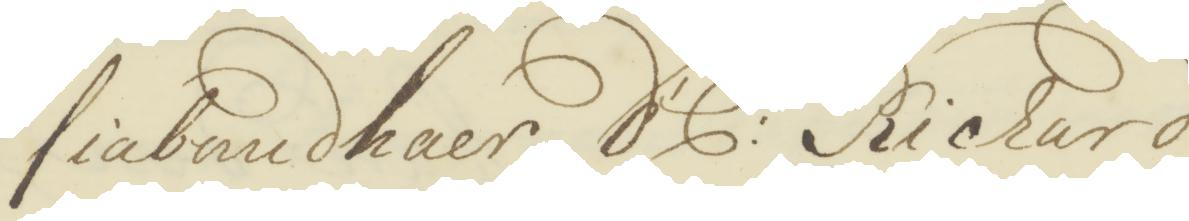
siaband haer d’E: Richard
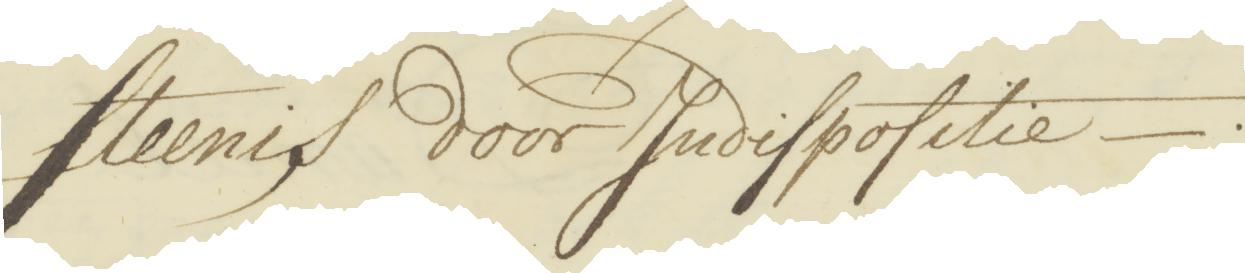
Steenis door Jndispositie —.
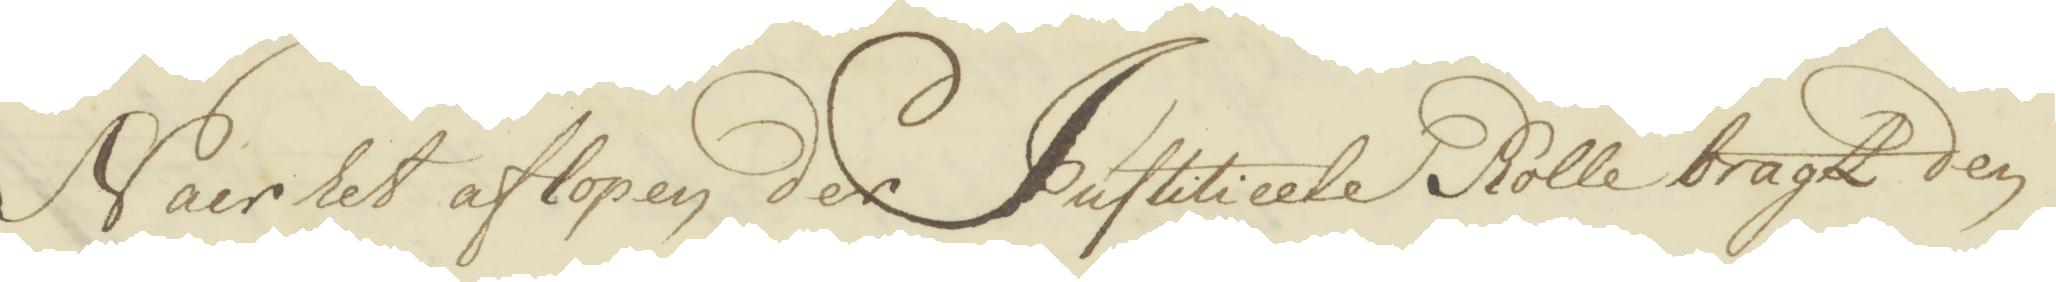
Naer het aflopen der Justitieele Rolle bragt den
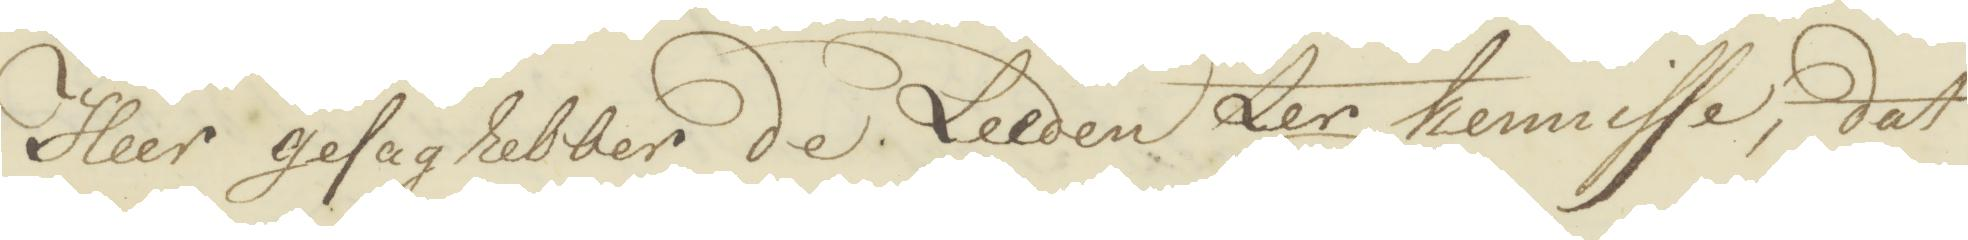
Heer gesaghebber de Leeden ter kennisse, dat
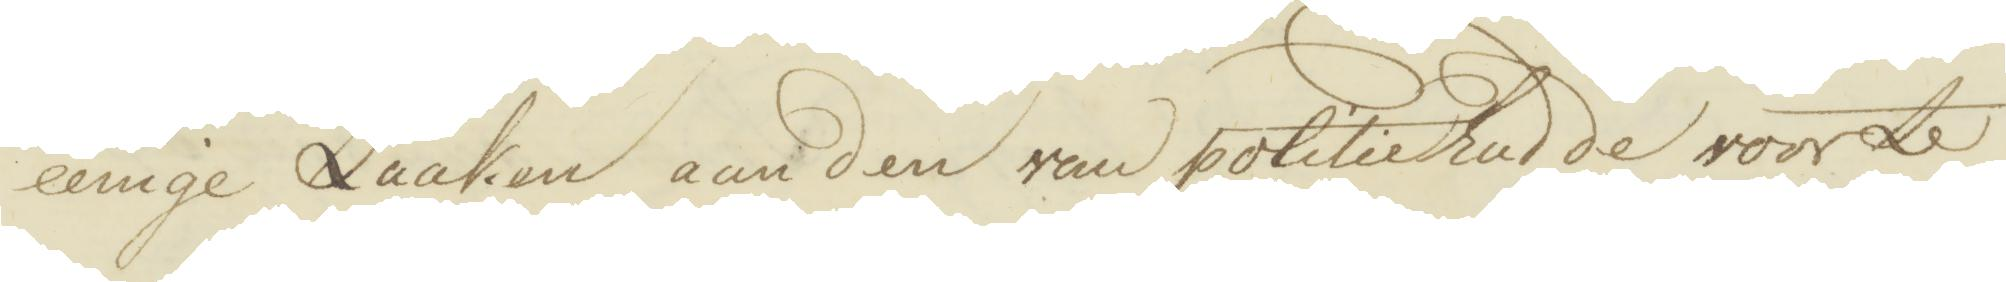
eenige zaaken aan den van politie hadde voor te
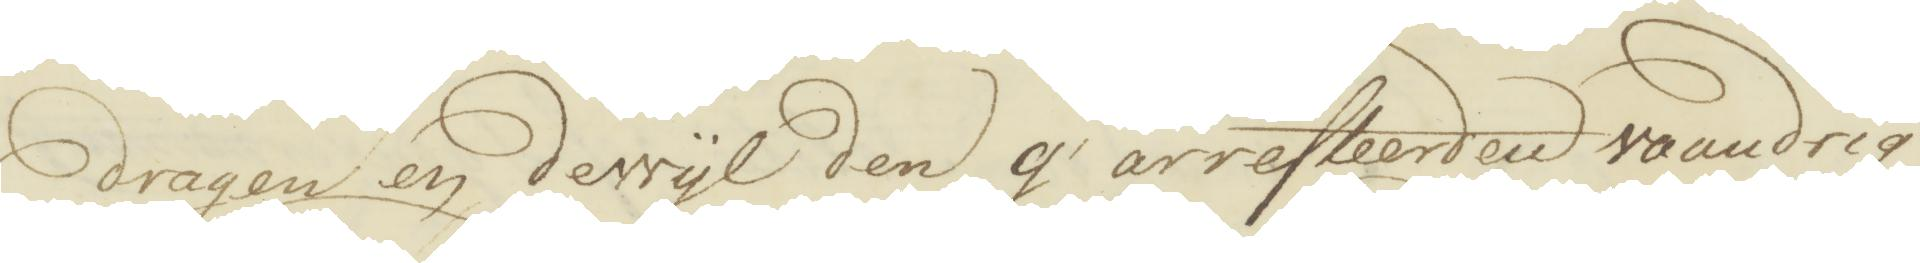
dragen en dewijl den g’ arresteerden vaandrig
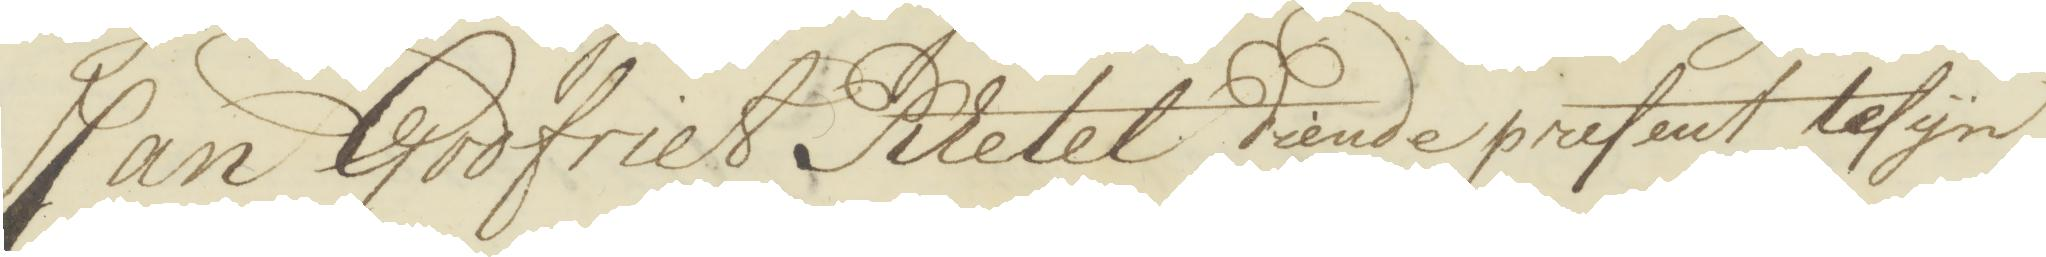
Jan Godfriet Rhetel diende present tesijn,
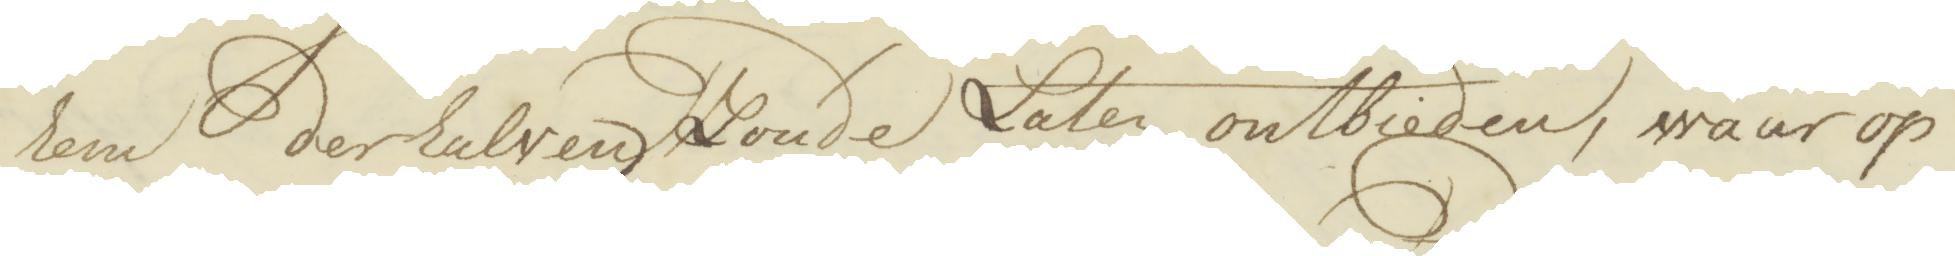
hem derhalven zoude laten ontbieden, waar op
